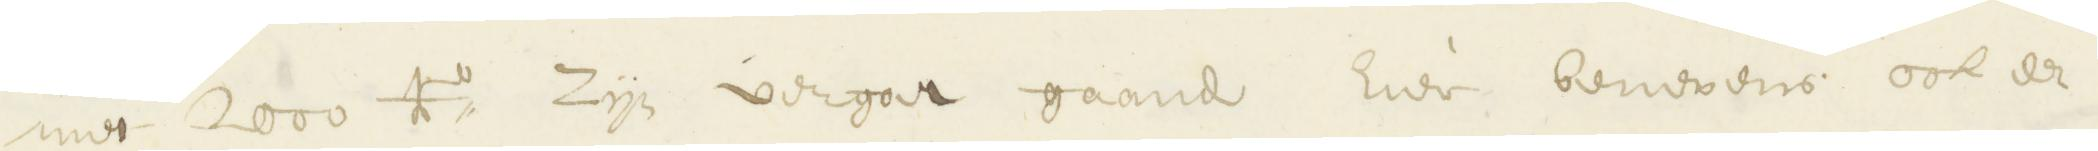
met 2000 r„o zijn vergoet gaande hier benevens ook een
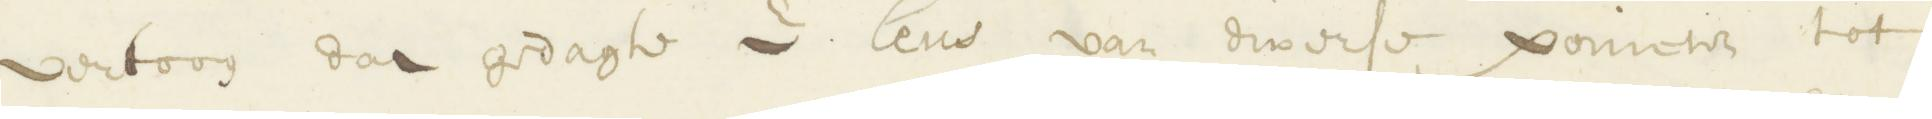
vertoog dat gedagte E. lens van diverse poincten tot
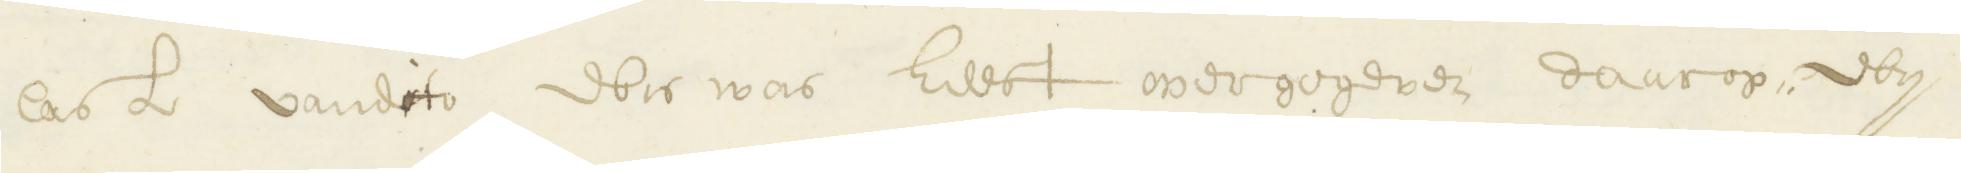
laste vandito wis was heeft overgegeven daarop„ wij
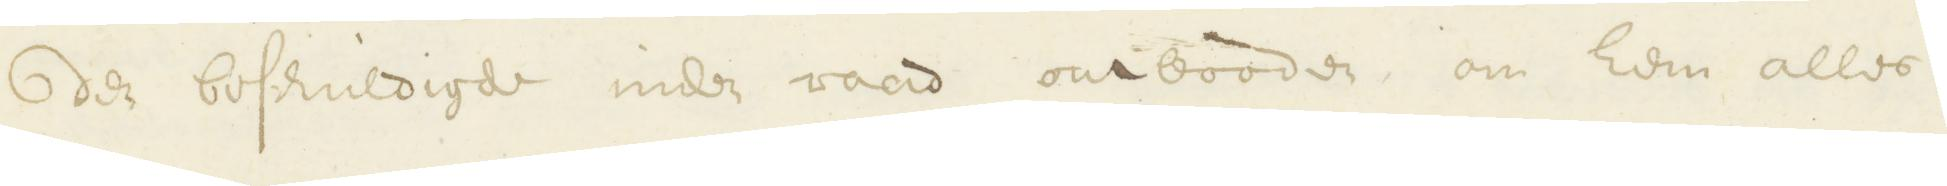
den beschuldigde inden raad ontbooden, om hem alles
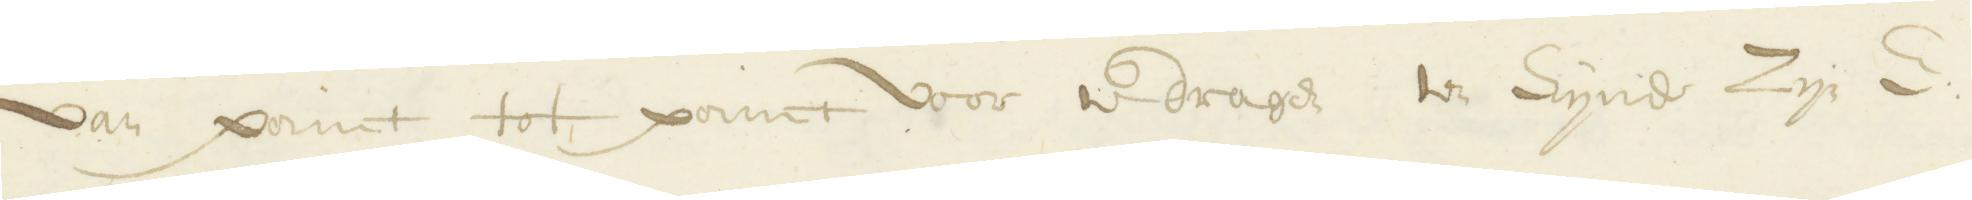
van point tot point voor te dragen ten Sijnde zijn E:
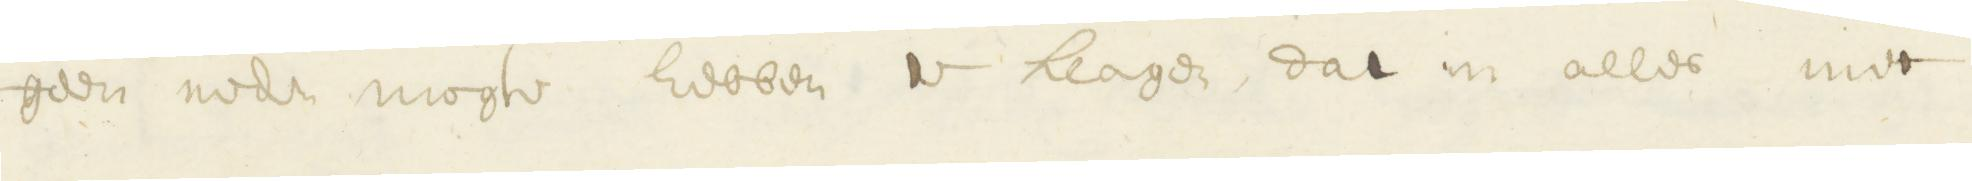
geen reden mogte hebben te klagen, dat in alles niet
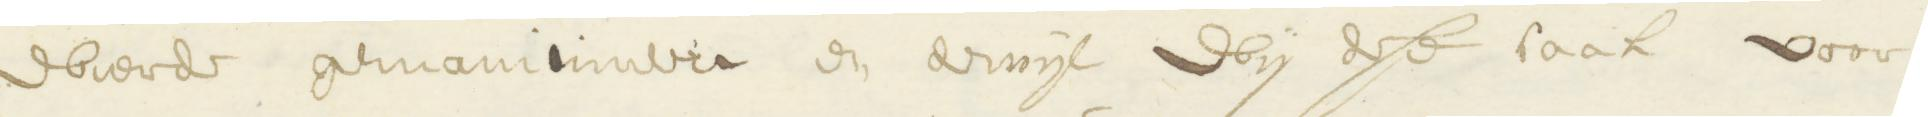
wierde gemaintineert en dewijl wij dese saak voor
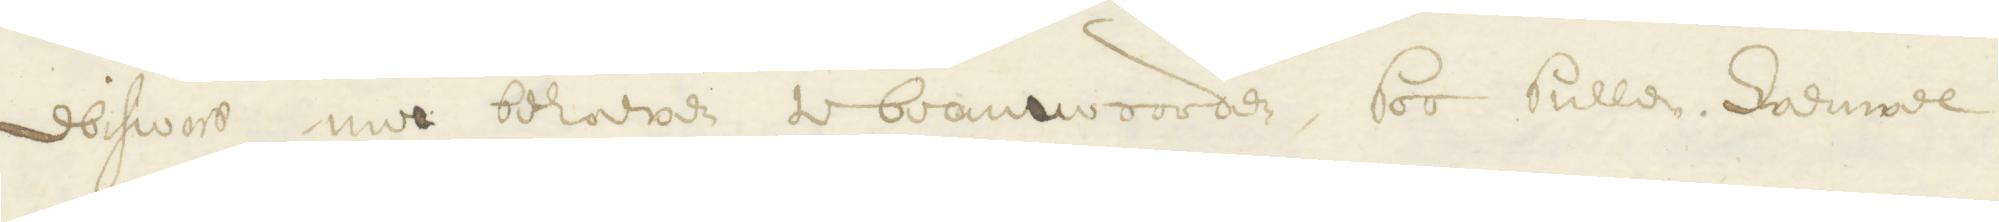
wisiord niet behoeven te beantwoorden, soo sullen. doenwel
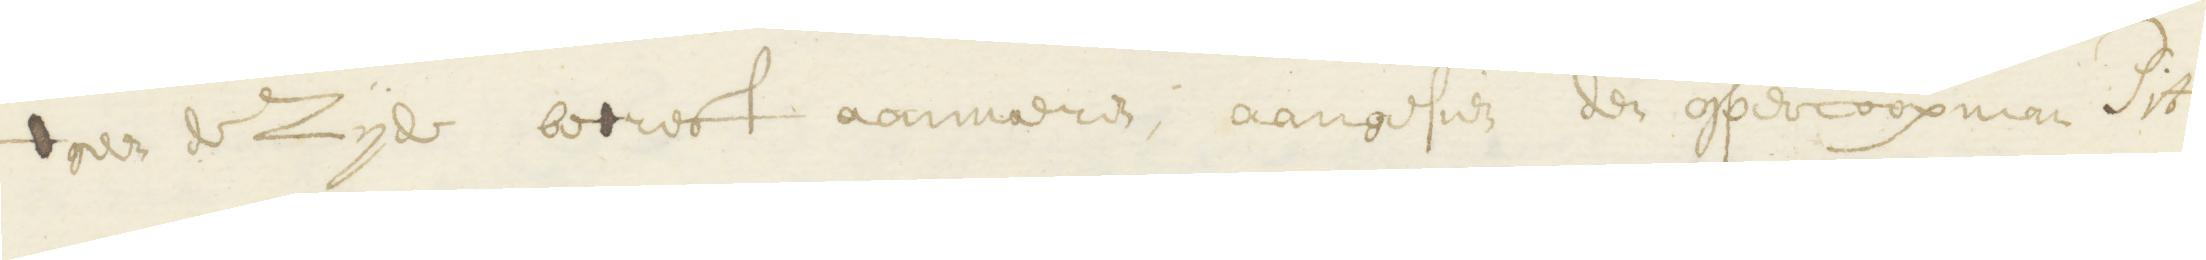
tgeen de Zijde betreft aanmaeren; aangesien den oppercoopman Pit
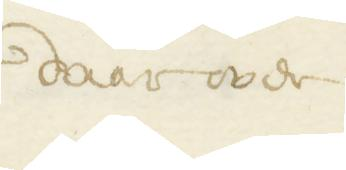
daar over
